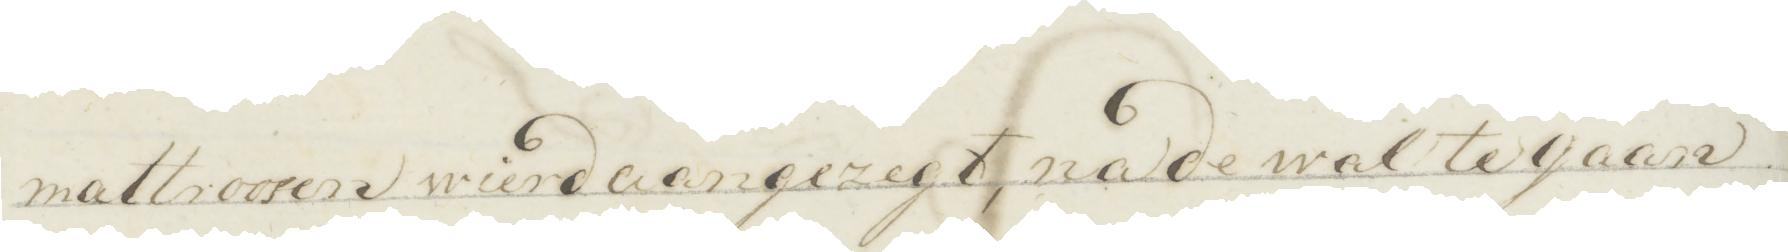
mattroosen wierd aangezegt, na de wel te gaan
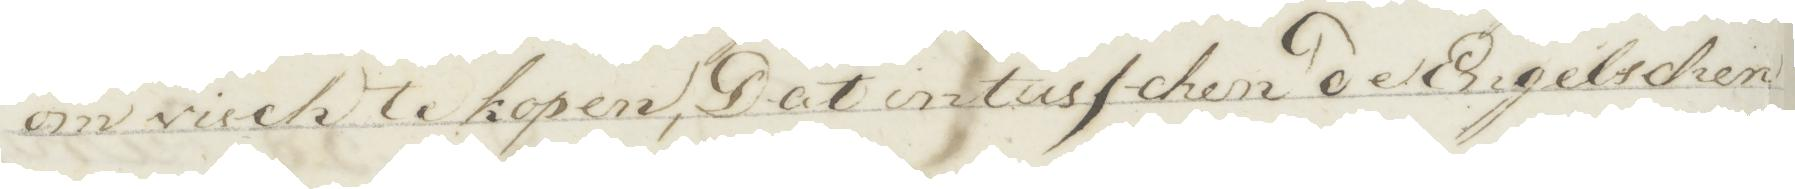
om visch te kopen, Dat intusschen de Engelschen
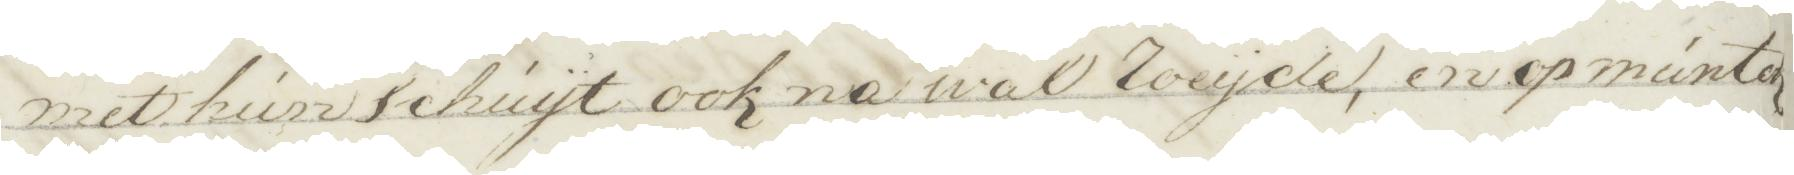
met hun schuijt ook na wal Roeijde, en op muntok
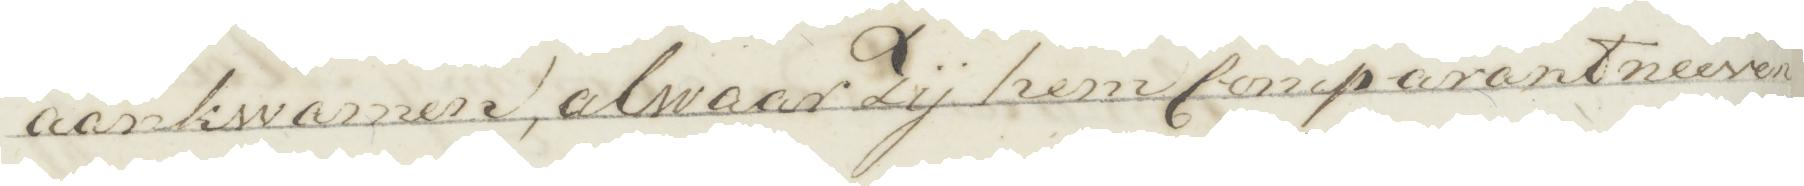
aankwamen, alwaar Zij hem Comparant neeven
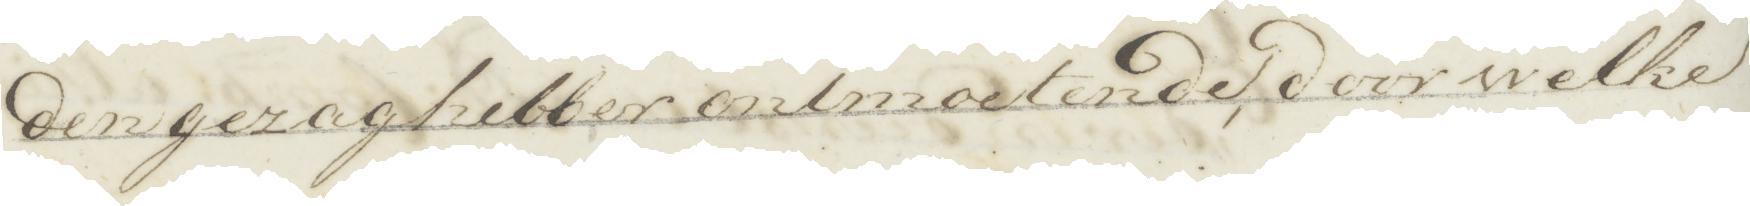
den gezag hebber ontmoetende door welke
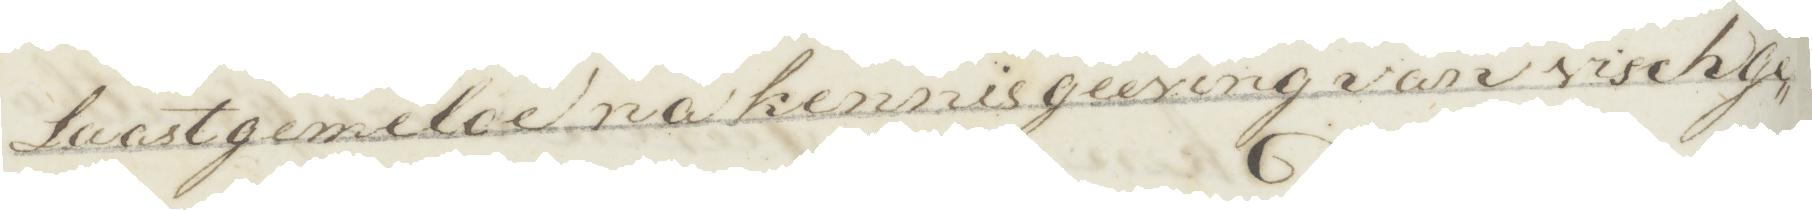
laast gemelde na kennis geeving van visch ge„
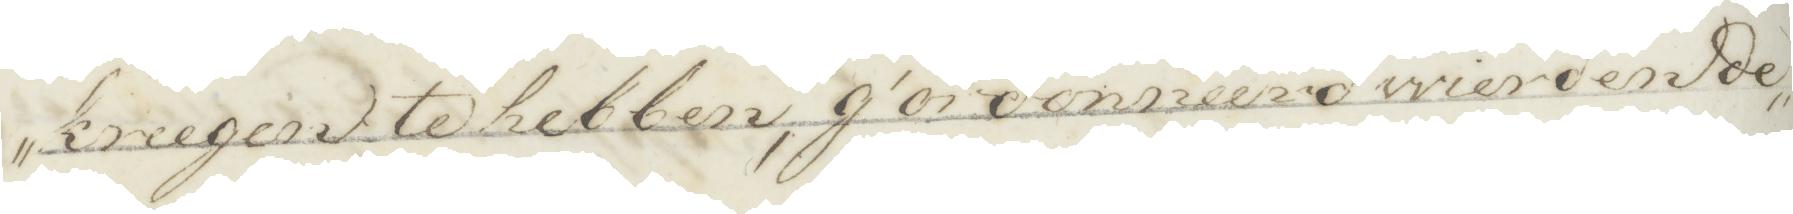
„kreegen te hebben, g’ordonneerd wierden de„
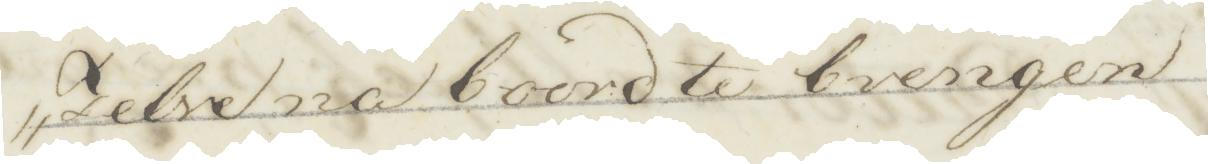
„Zelve na boord te brengen
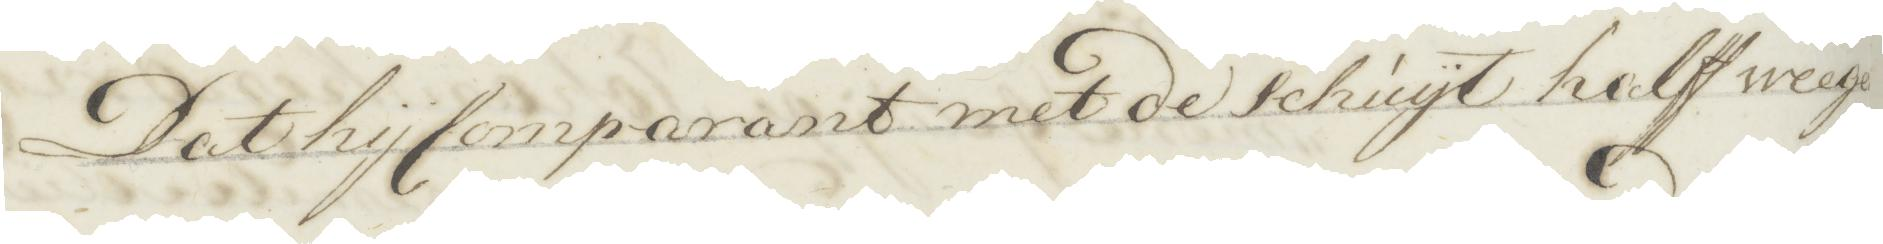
Dat hij Comparant met de schuijt halff weege
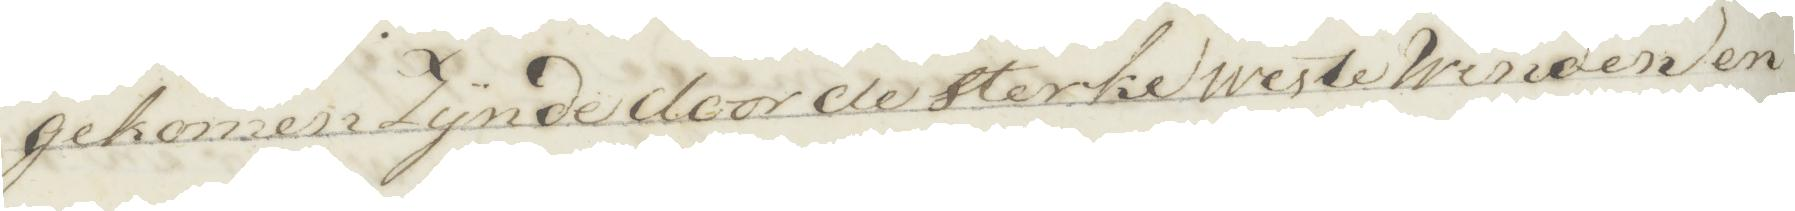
gekomen Zijnde door de sterke Weste Winden en
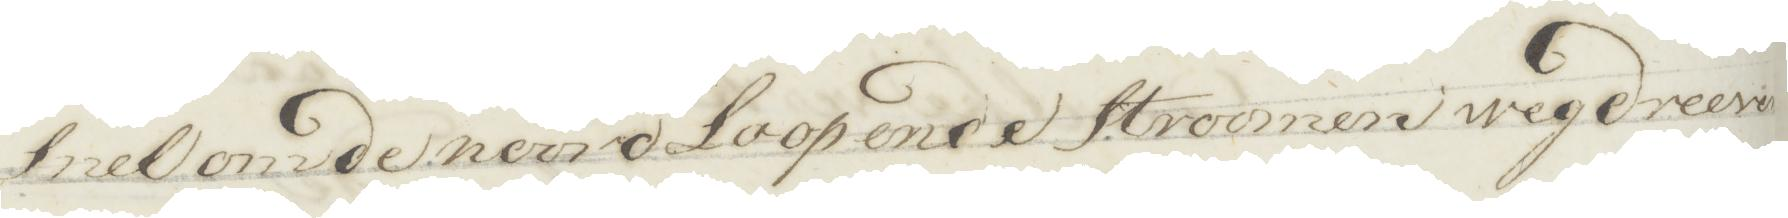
Snel om de noord Loopende stroomen weg dreeven
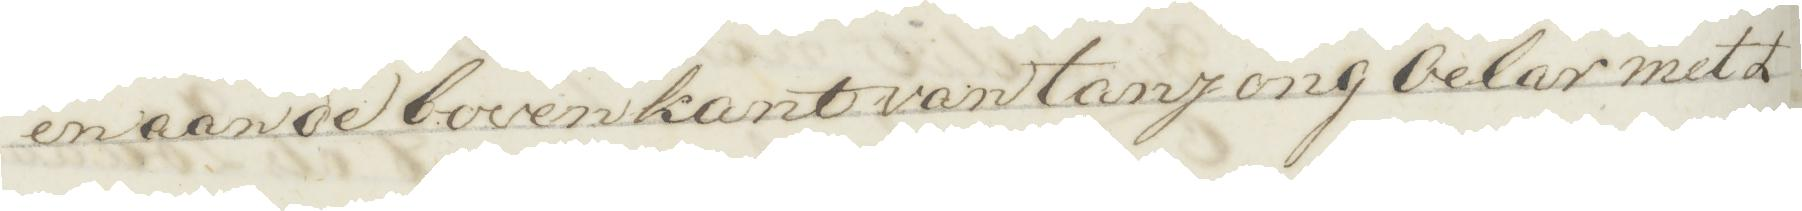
en aan de bovenkant van Tanjong belar met t
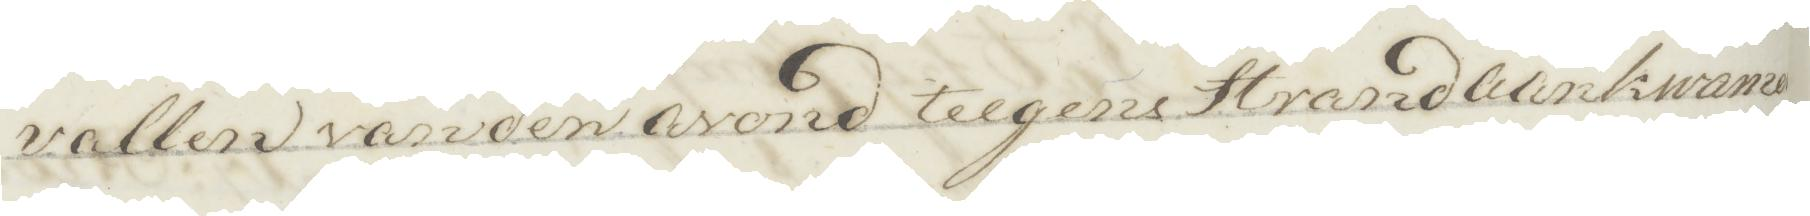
vallen van den avond teegens Strand aankwame
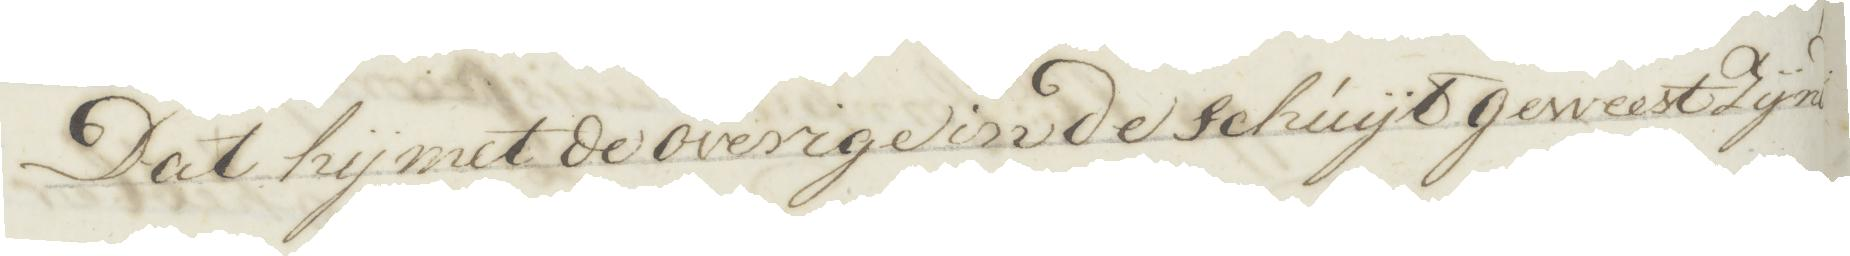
Dat hij met de overige in de schuijt geweest Zijn
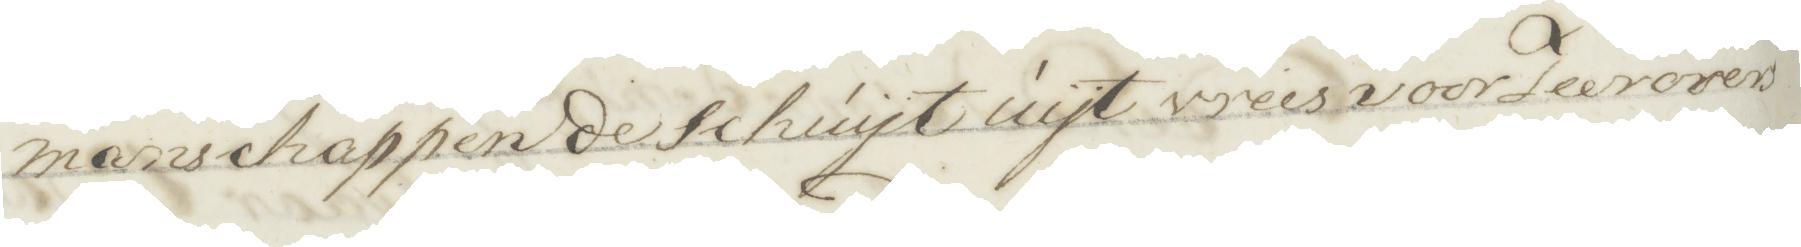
manschappen de schuijt uijt vrees voor Zeerovers
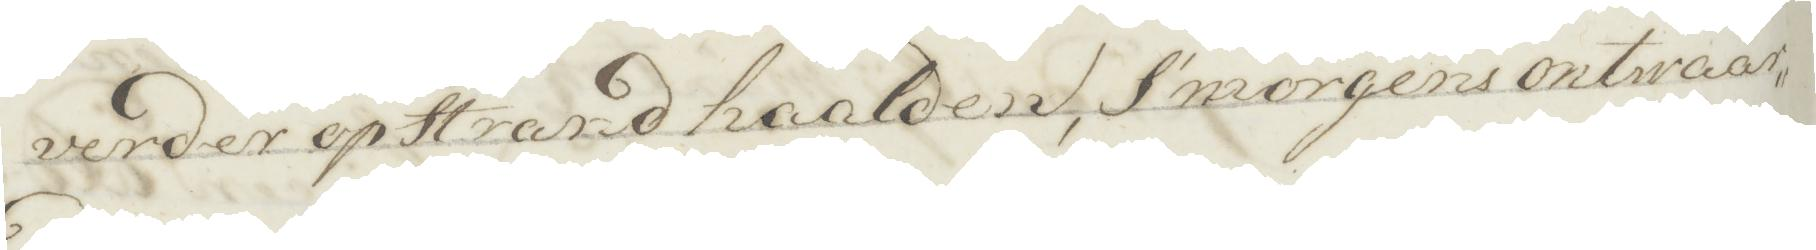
verder op strand haalden, 'S morgens ontwaar„
